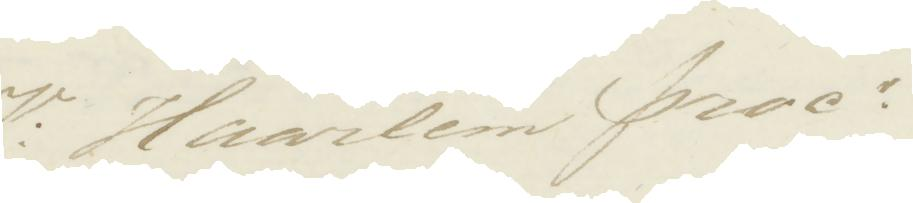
V. Haarlem Proc.r
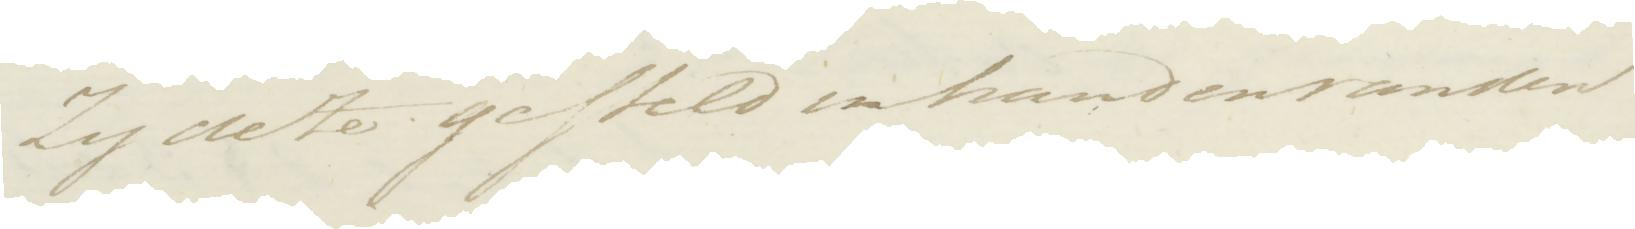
zy deze gesteld in handen vanden
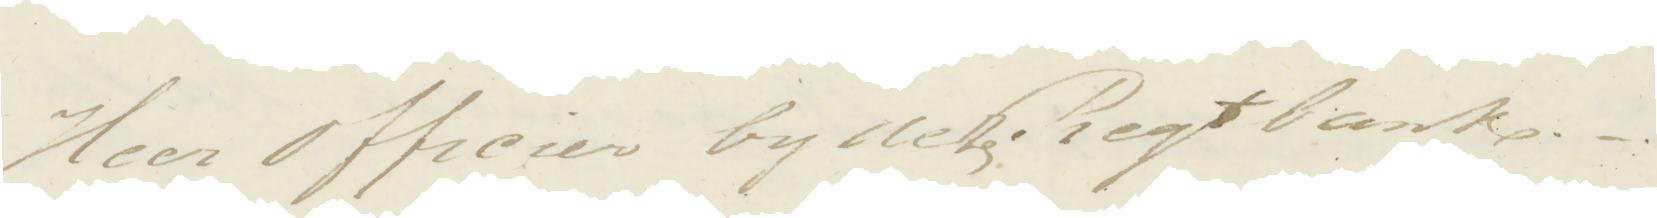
Heer officier by deze Regt bank. -
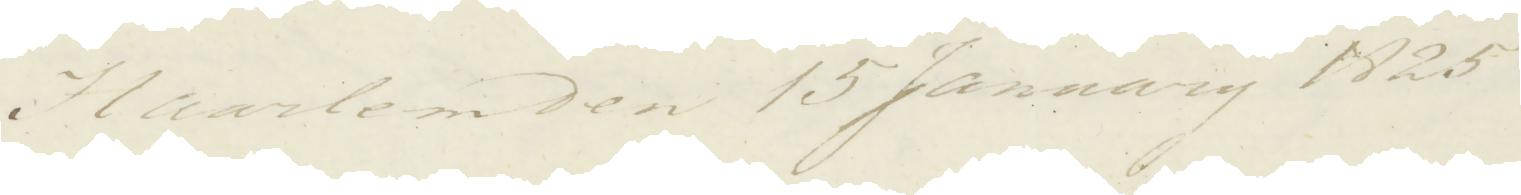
Haarlem den 15 January 1825
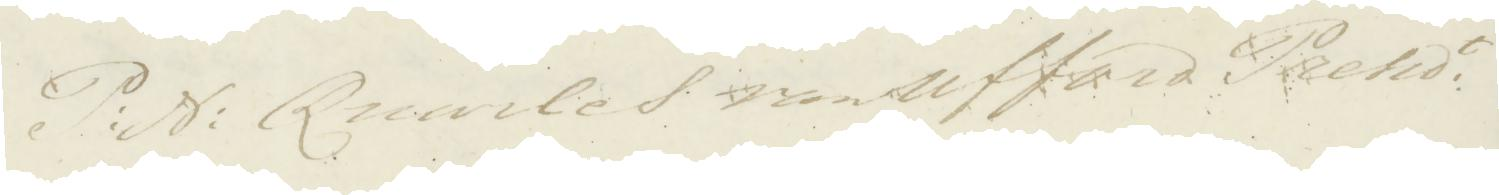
P:N: Quarle S van Ufford Presid.t
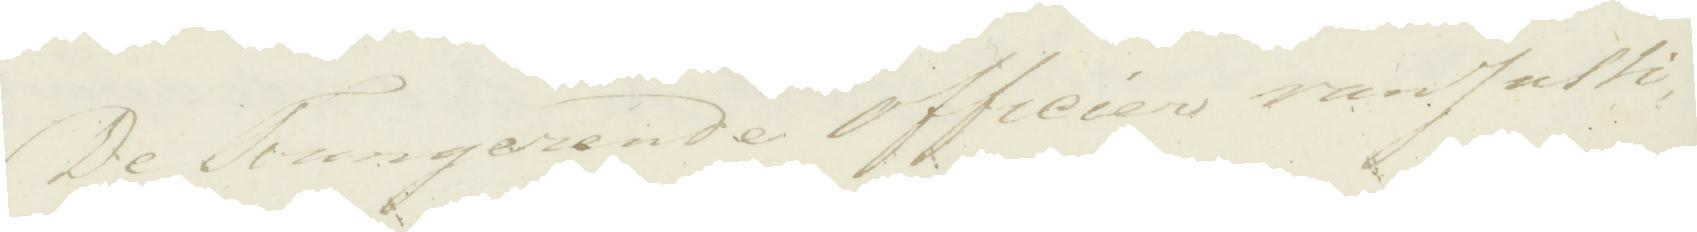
De Fungerende officier van Justi,
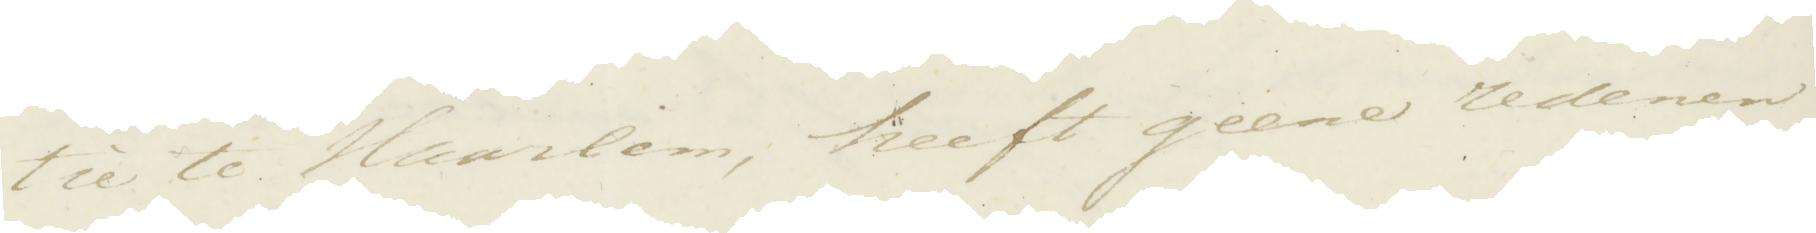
tie te Haarlem, heeft geene redenen
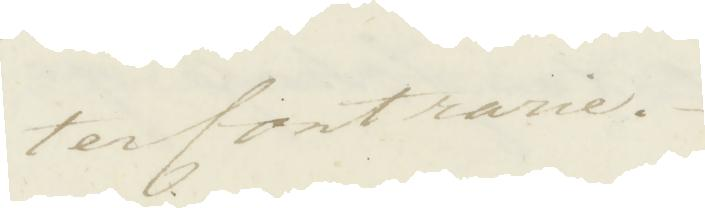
ter Contrarie.-
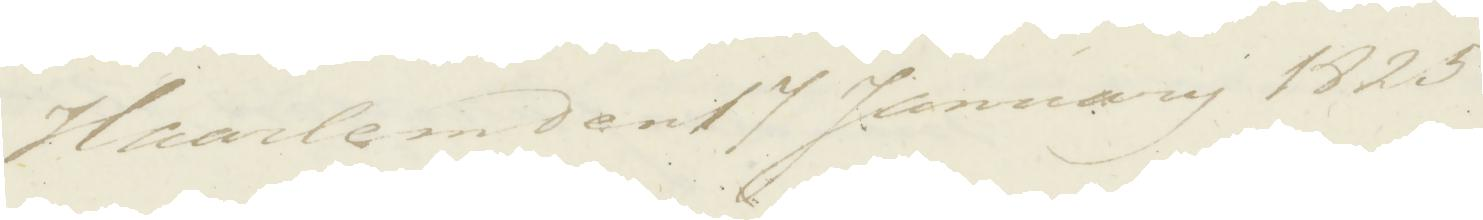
Haarlem den 17 Januarij 1825
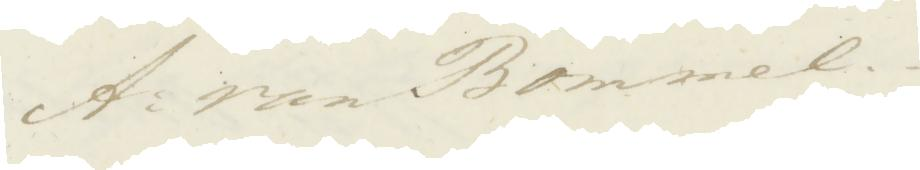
A: van Bommel.
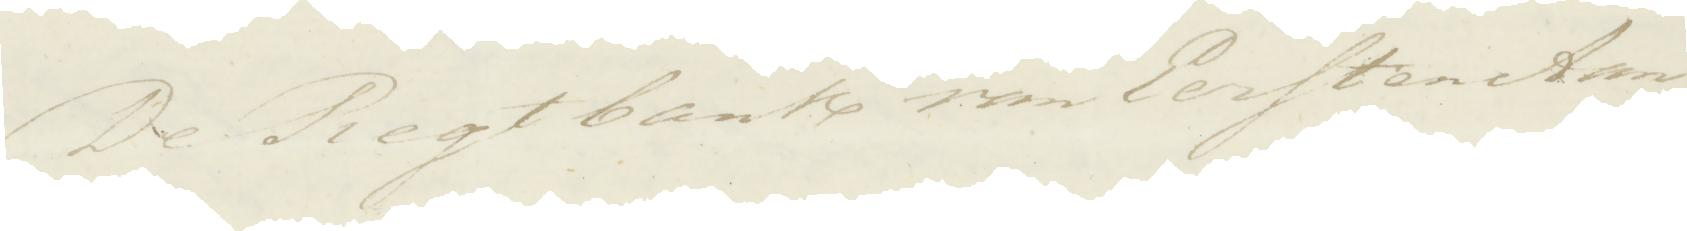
De Regtbank van Eersten Aan
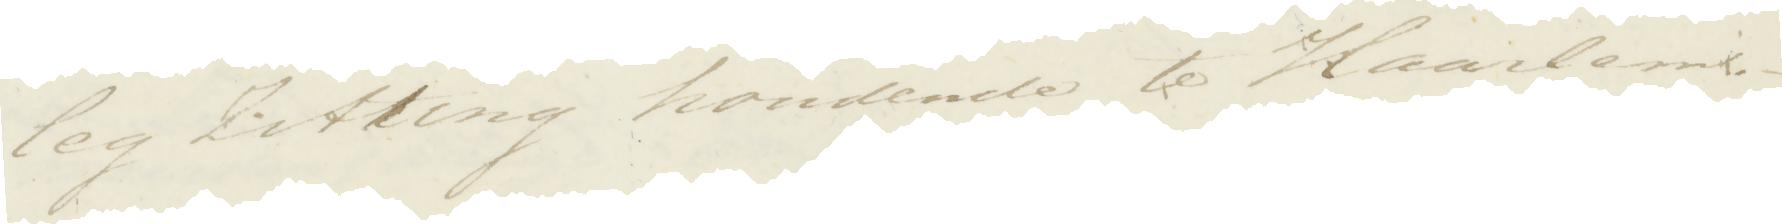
leg zitting houdende te Haarlem,
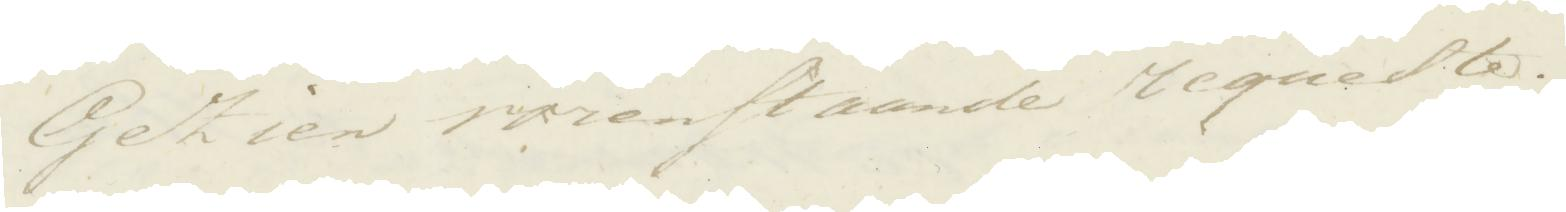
Gezien vorenstaande requeste.
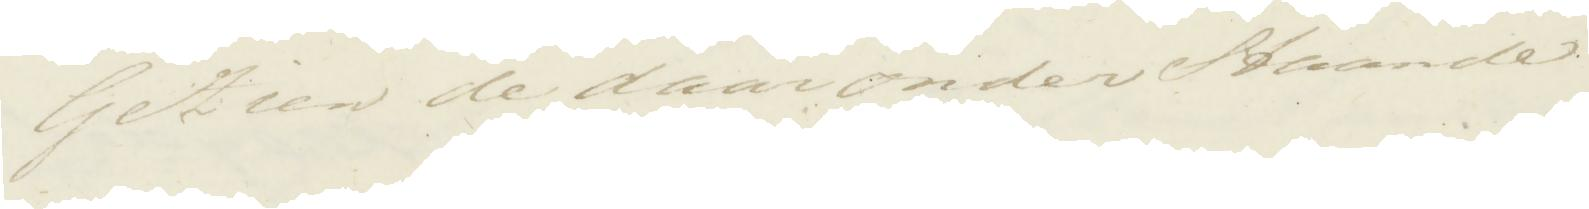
Gezien de daaronder staande
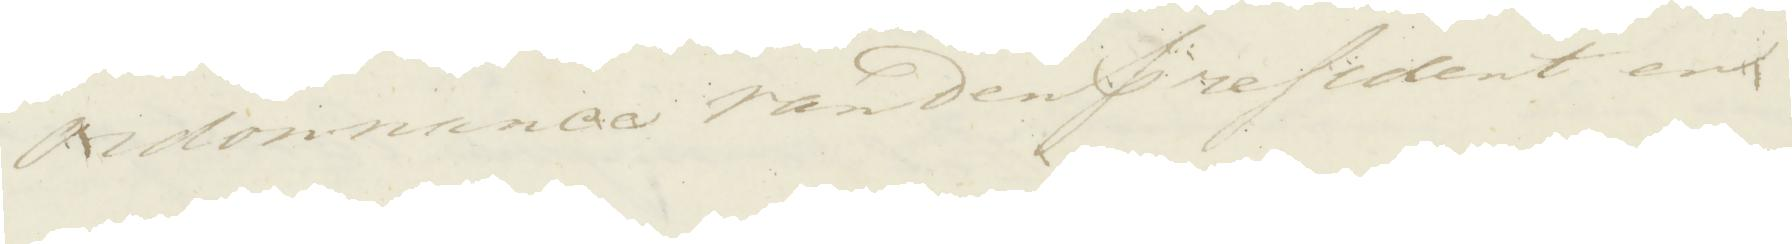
ordonnance van den president en
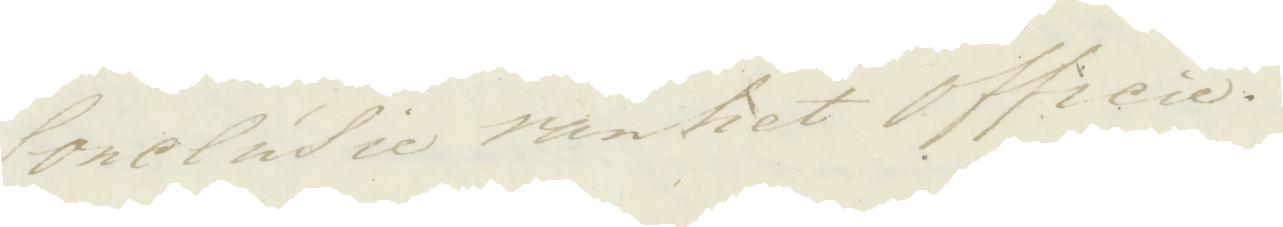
Conclusie van het officie.
